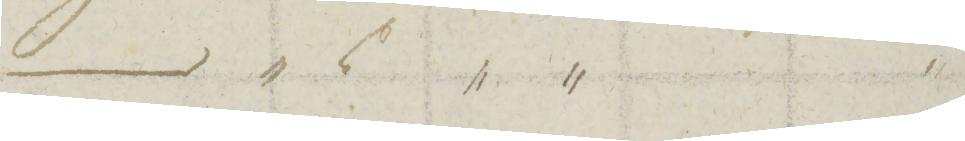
— „ 5. „ „ „
